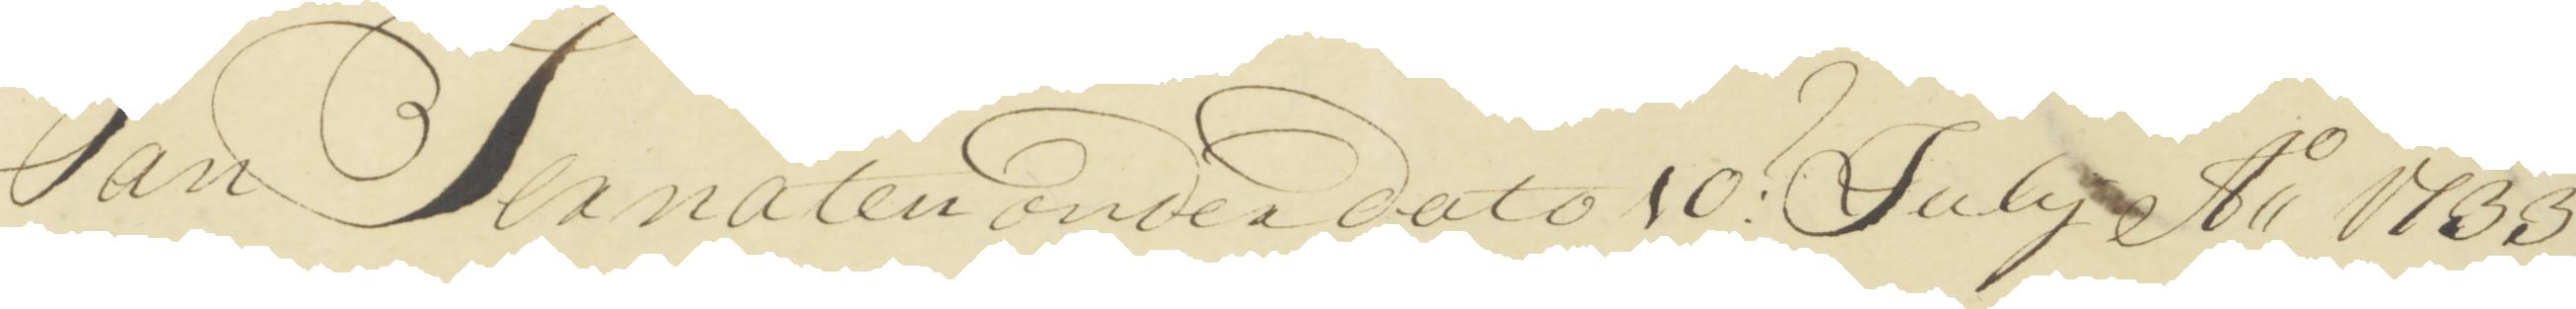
Van Ternaten onder dato 10:' Iuly A„o 1733
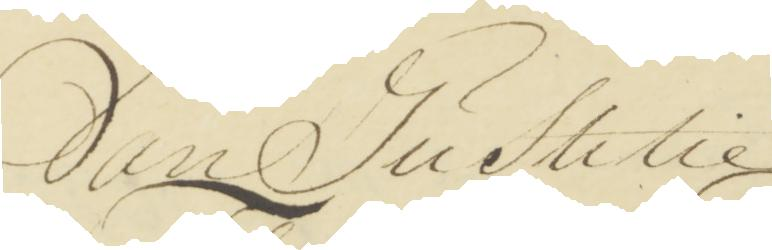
Van Iustitie
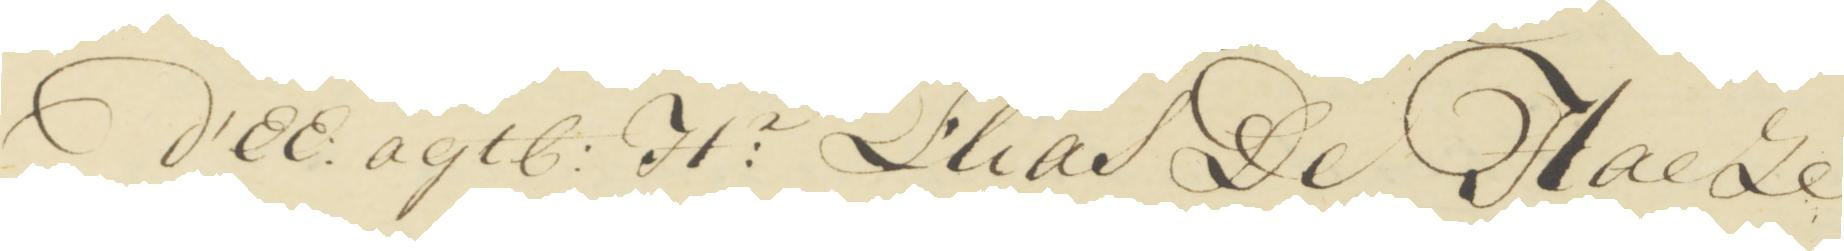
d’ EE: agtb: H:r Elias De Haeze
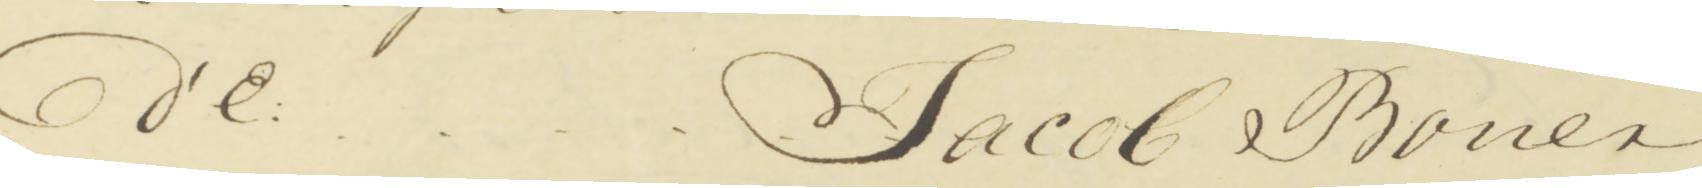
d’ E: . . . . . . . Iacob Boner
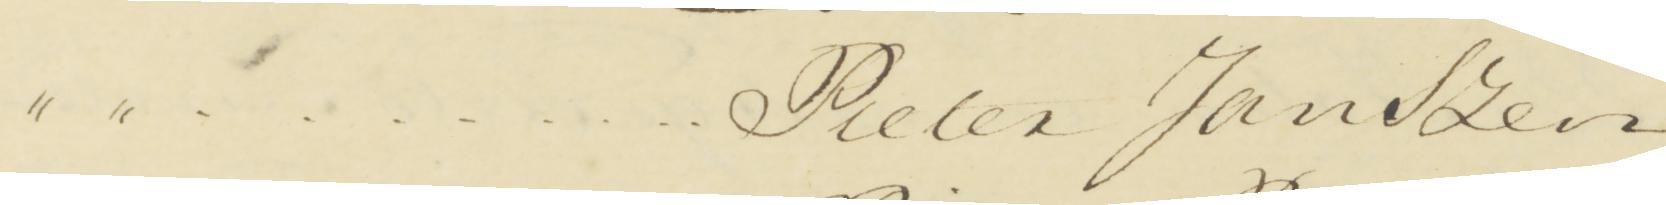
„ „ . . . . . . . . Pieter Janszen
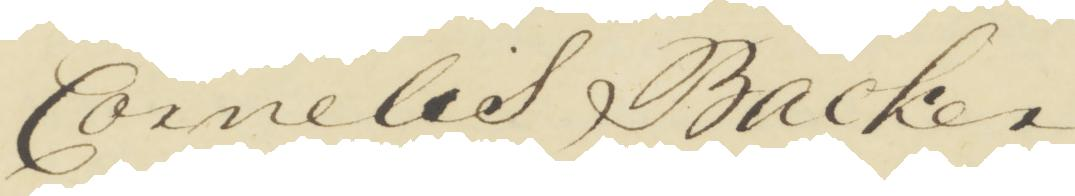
Cornelis Backer
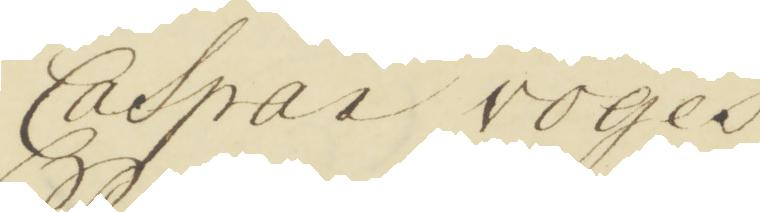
Caspar voges
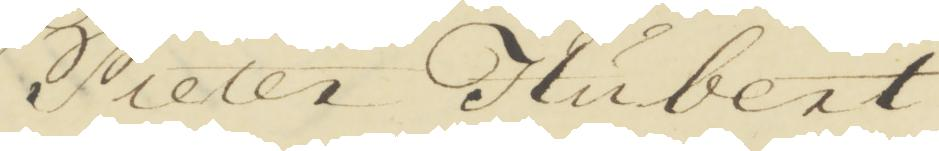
Pieter Hubert
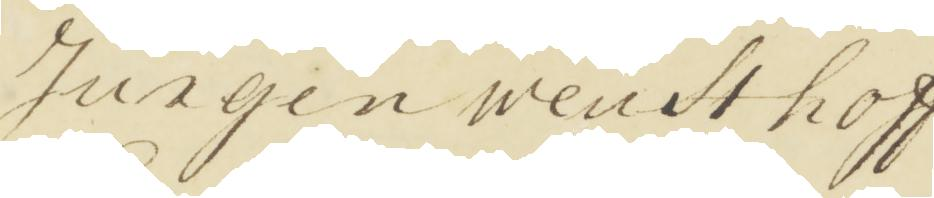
Jurgen weusthoff
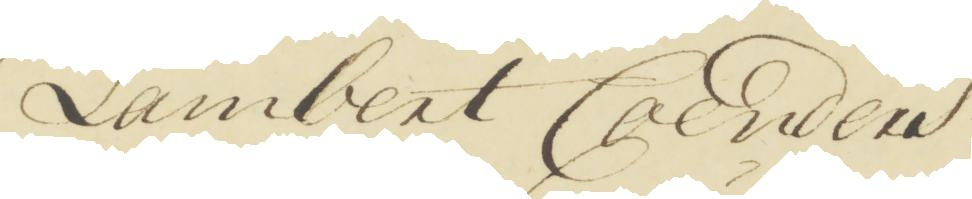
Lambert Coenders
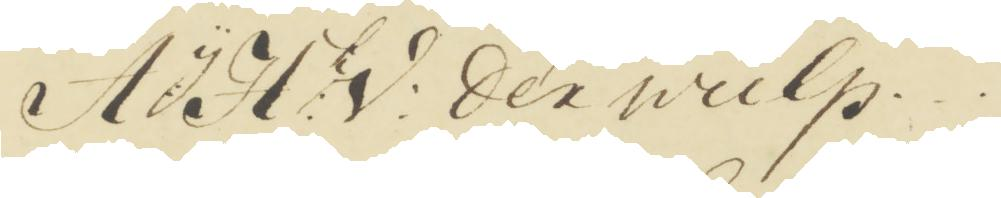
A:ij H:k V: der wulp
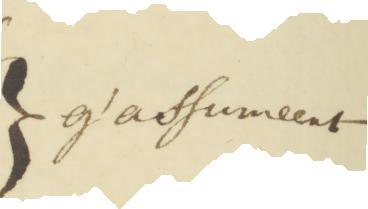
} g’assumeert
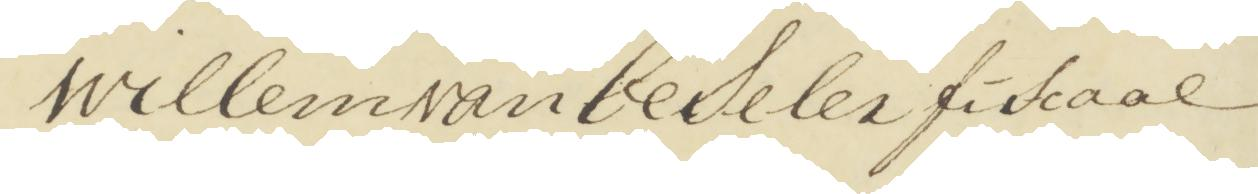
willem van beseler fiscaal
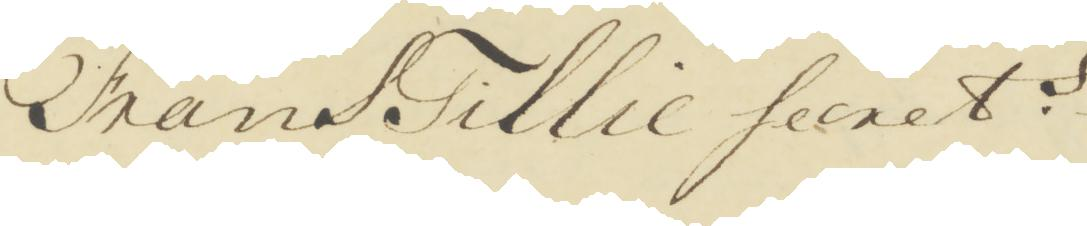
Frans Tillie secret.s
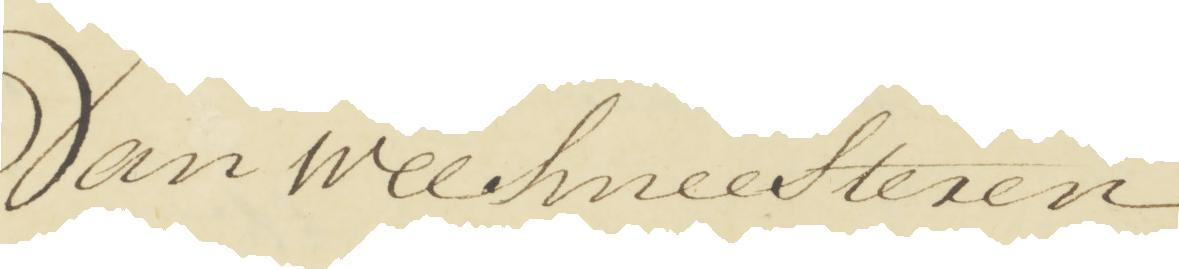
Van weesmeesteren
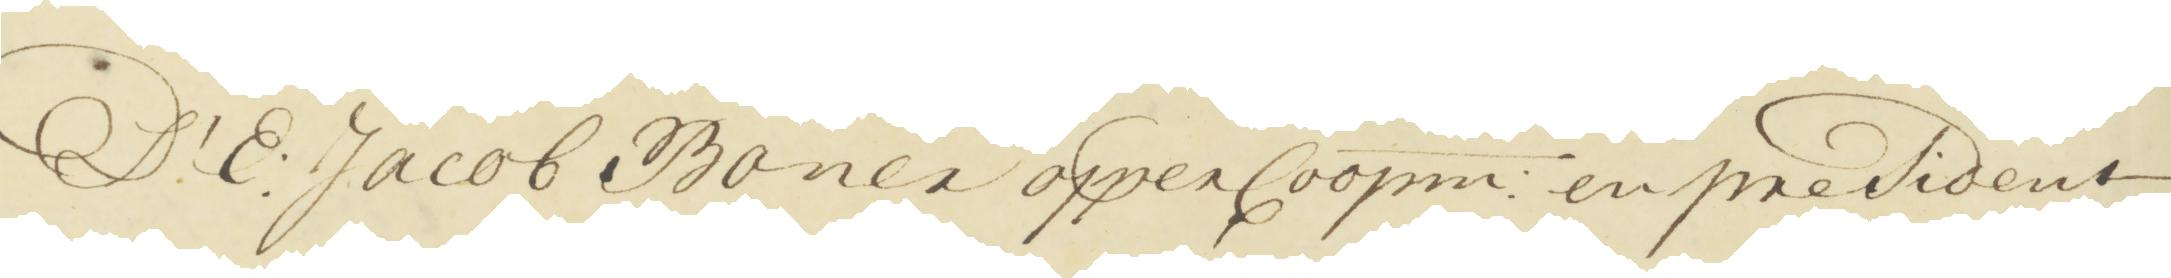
D' E: Jacob Boner oppercoopm: en president
